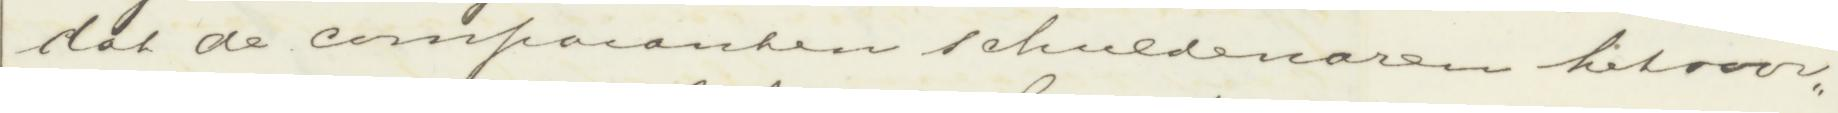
dat de comparanten schuldenaren het voor„
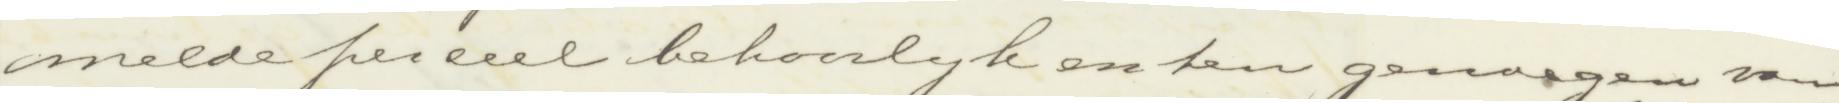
melde perceel behoorlyk en ten genoegen van
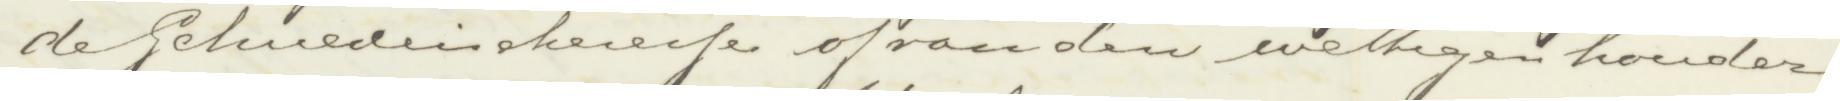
de Schuldeischeresse of van den wettigen houder
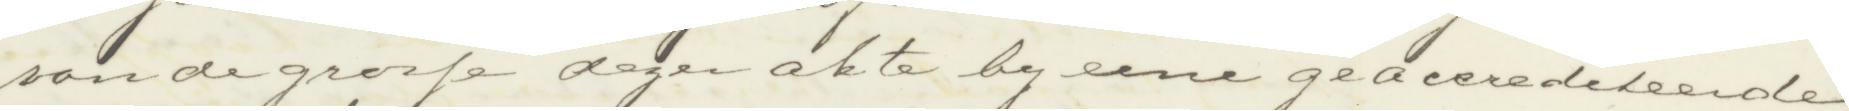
van de grosse dezer akte by eene geaccrediteerde
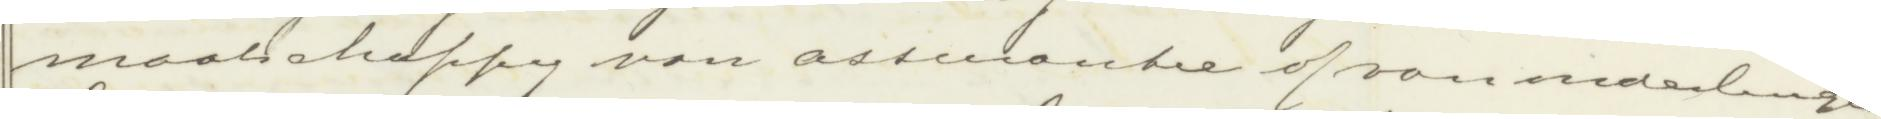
maatchappy van assurantie of van onderlinge
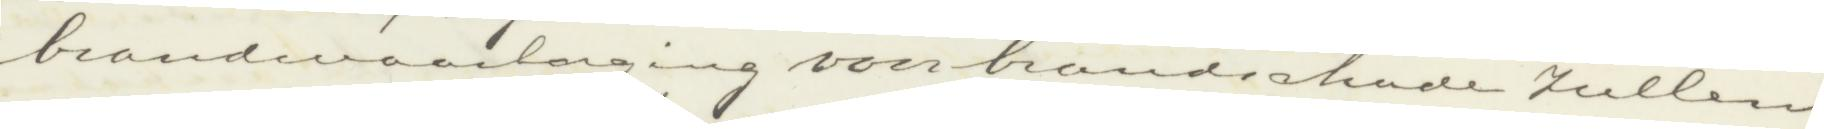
brandwaarborging voor brandschade zullen
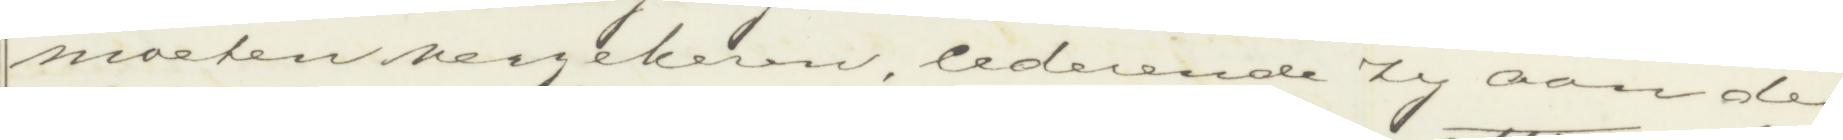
moeten verzekeren, cederende zy aan de
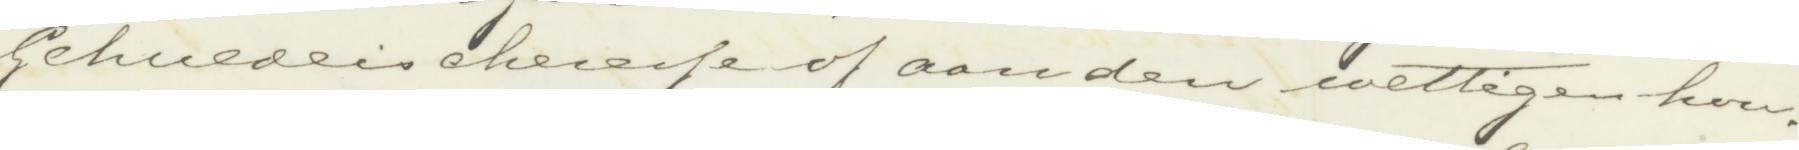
Schuldeischeresse of aan den wettigen hou„
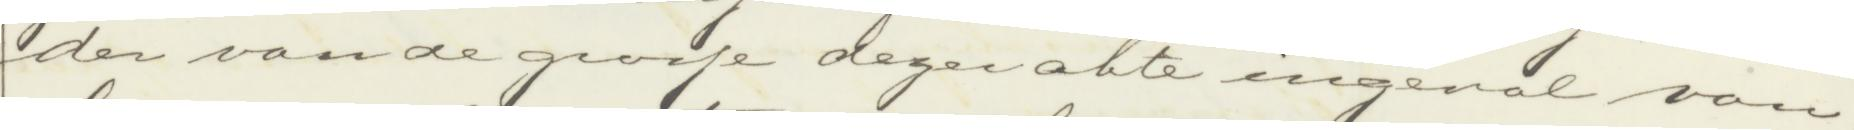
der van de grosse dezer akte ingeval van
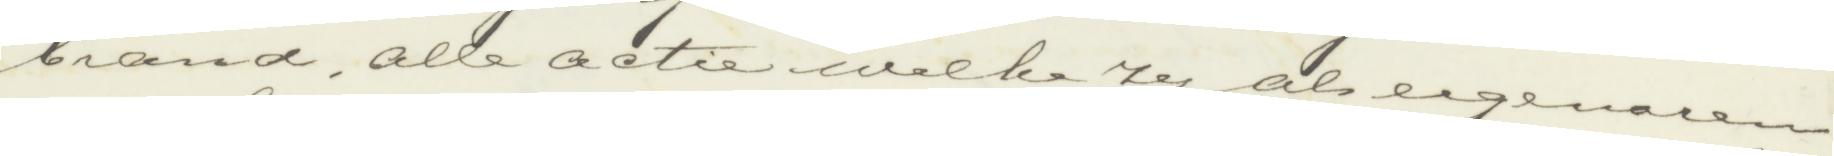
brand, alle actie welke zy als eigenaren
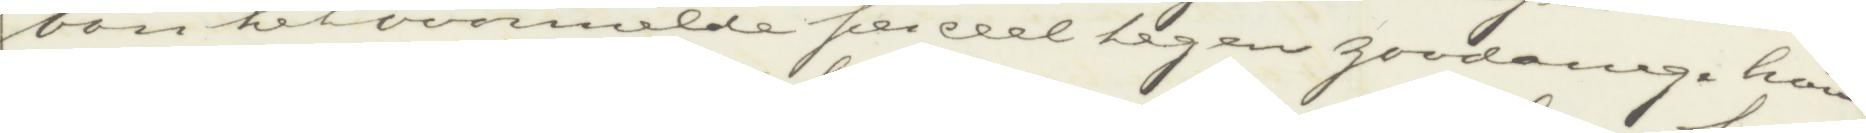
voor het voormelde perceel tegen zoodanige brand
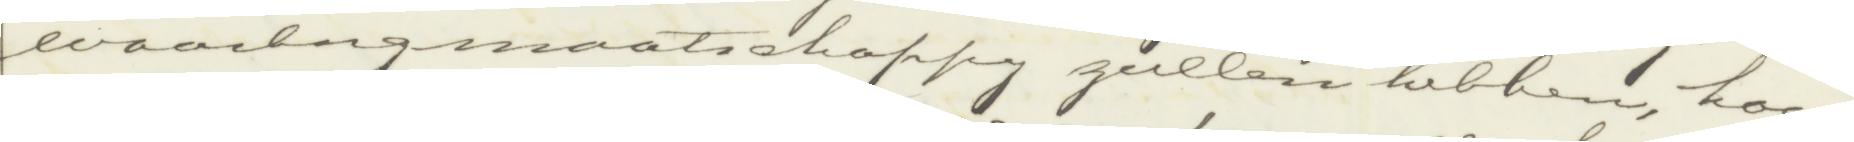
waarborg maatschappy zullen hebben, haar
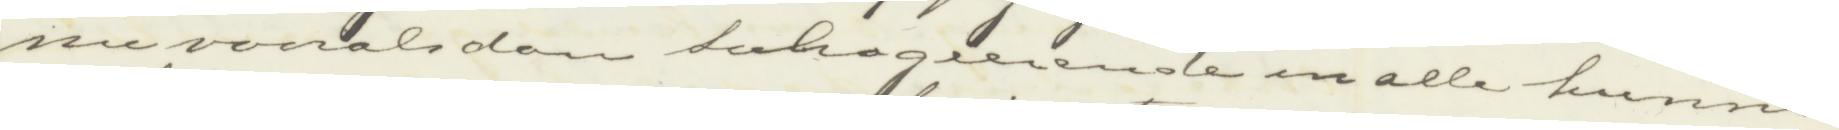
nu voorals dan subrogeerende in alle hunne
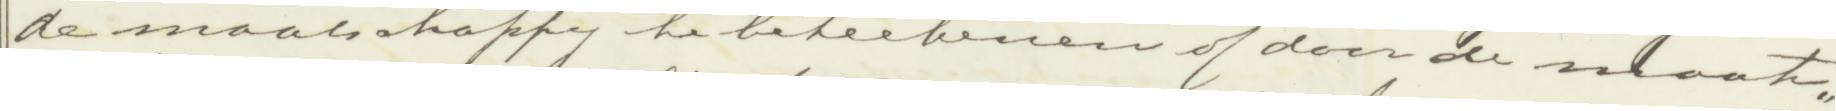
de maatschappy te beteekenen of door de maat„
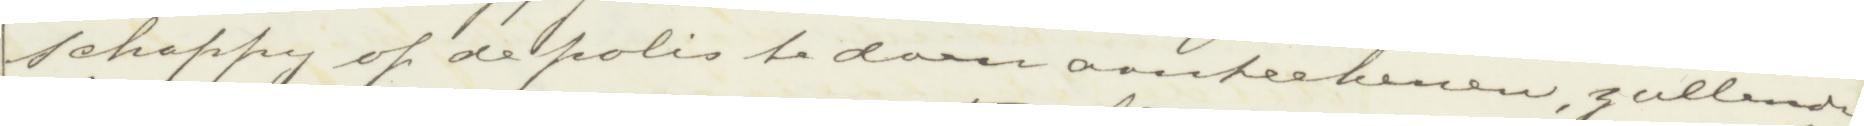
schappy op de polis te doen aanteekenen, zullende
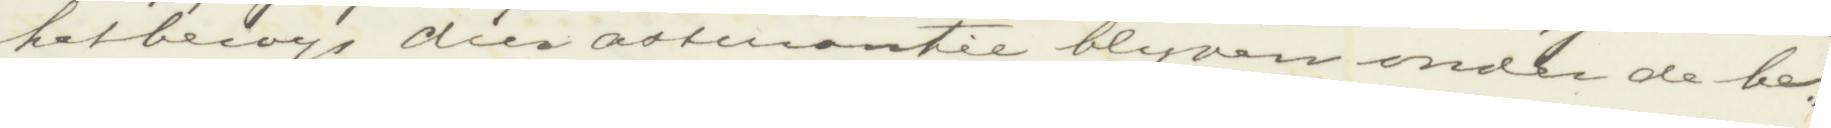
het bewys dier assurantie blyven onder de be„
